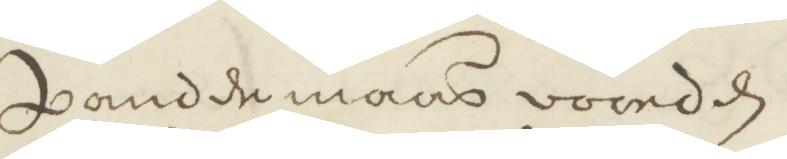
Vander maas voorden
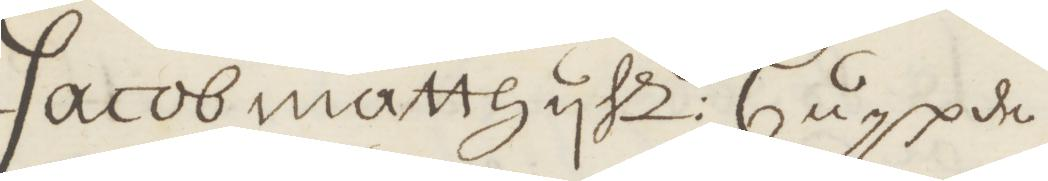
Jacob matthijsz: Cuyper
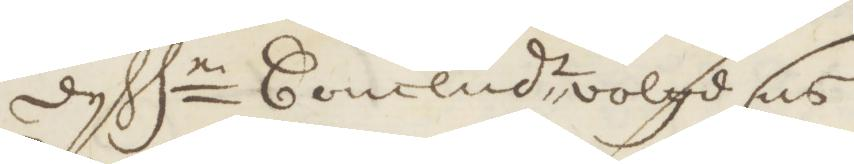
eyss=r Conclud„t volge ns
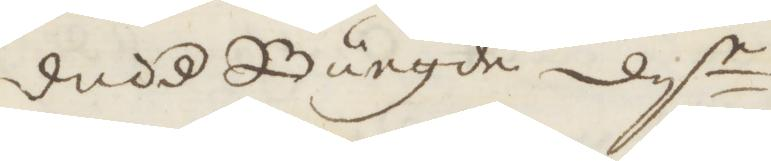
ende Burger ey=r
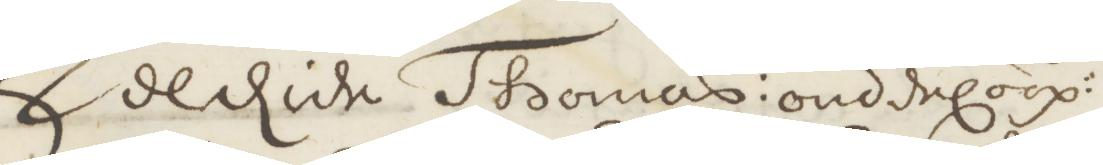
Melchier Thomas: onderCoop:
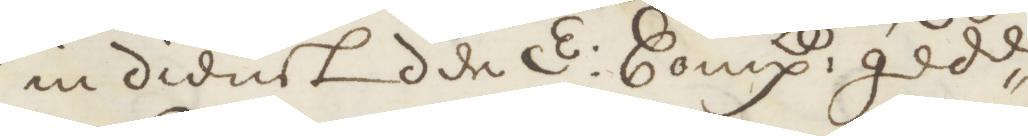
in dienst der E: Comp:e ged„e
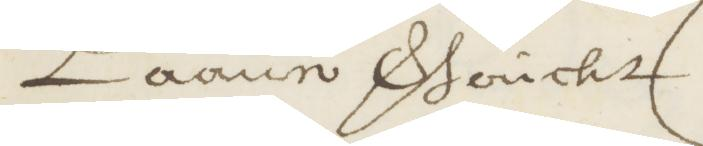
Paauw versouckt
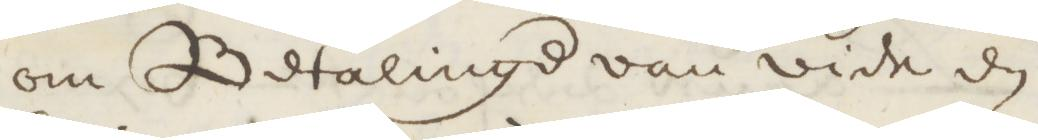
om Betalinge van vier en
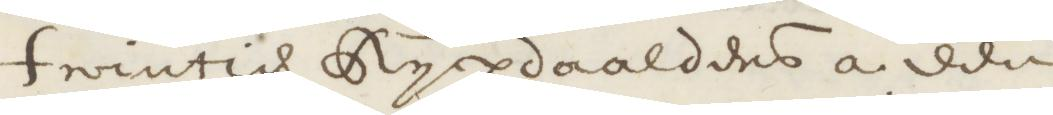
twintich Rycxdaalders a een
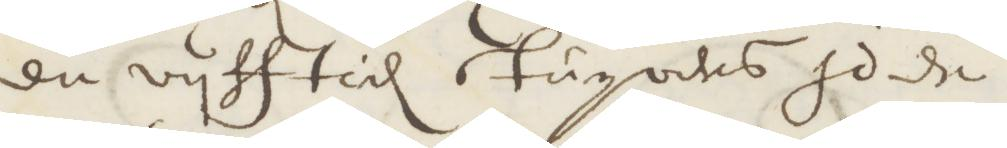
en vijfftich stuyvers jder
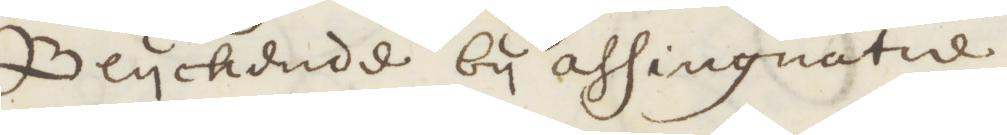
Blijckende bij assingnatie
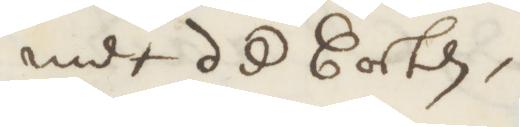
met de Costen,
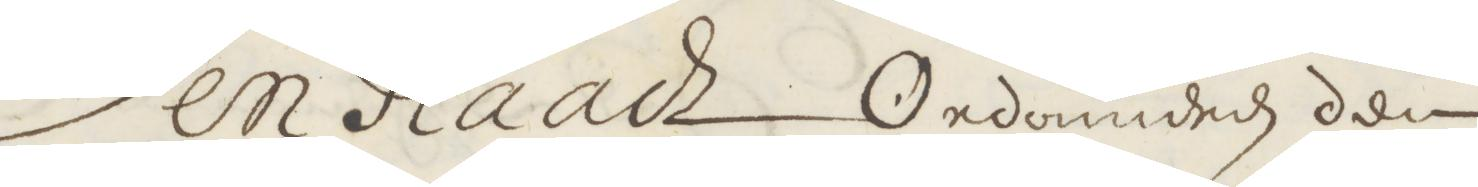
Den Raadt Ordonneren den
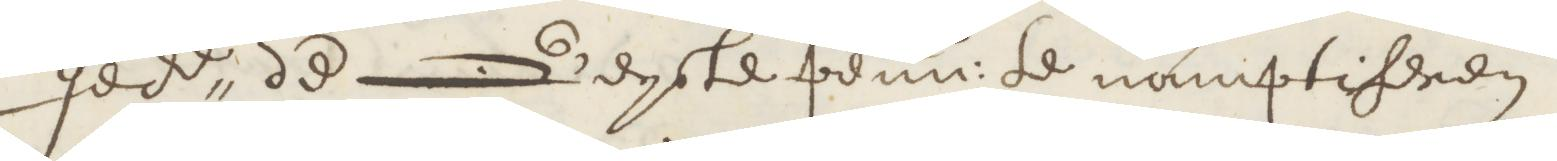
ged„e de Geyste penn: te namptiseren
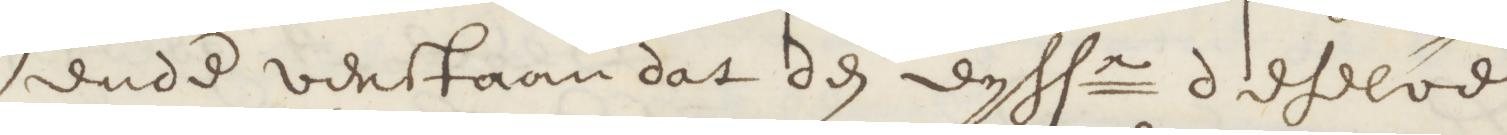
ende verstaan dat den eijss=r deselve
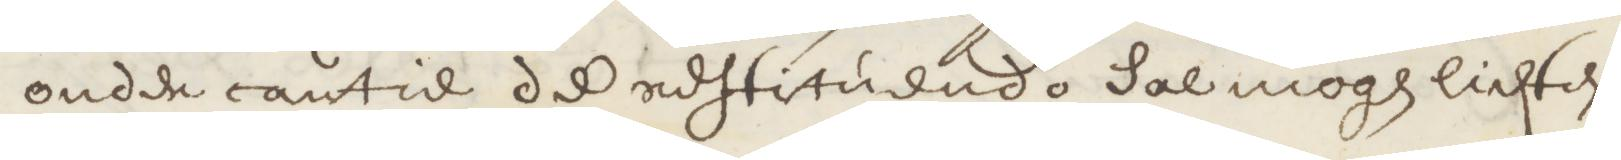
onder cautie de restituendo sal mogen lichten,
